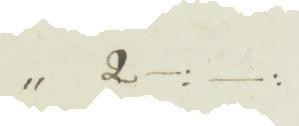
„ 2 —: —:
